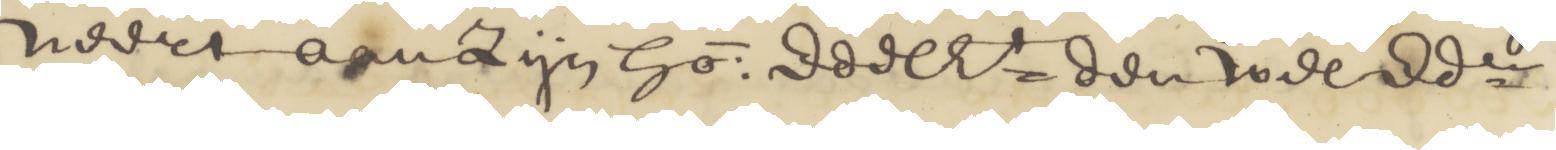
neert aan zijn ho: Edelh=t den wel Ed=e
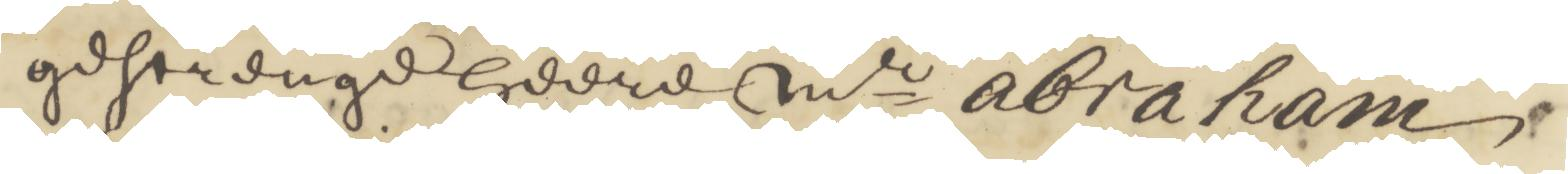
gestrenge heere m=r abraham
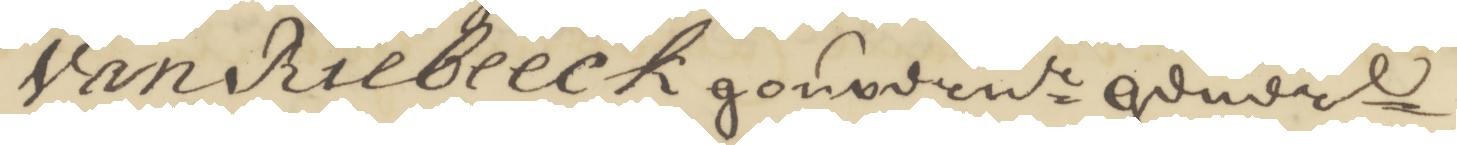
van Riebeeck gouvern=r gener=l
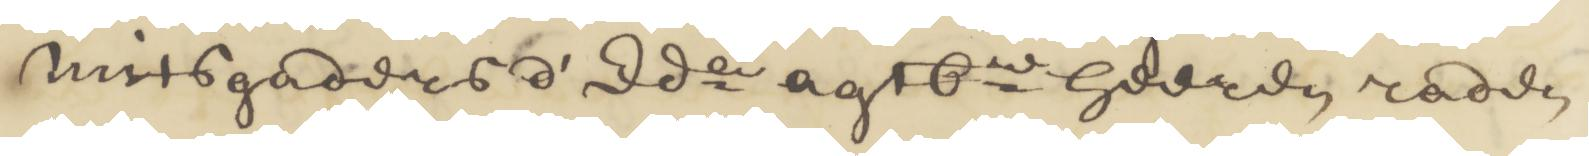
mitsgaders d'Ed=le agtb=re heeren raden
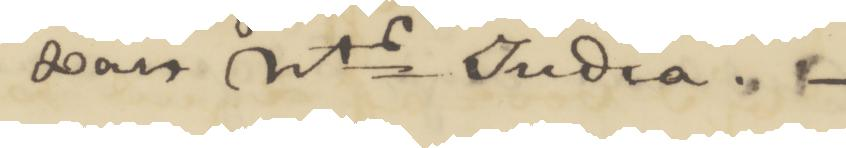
van n=ts Jndia.
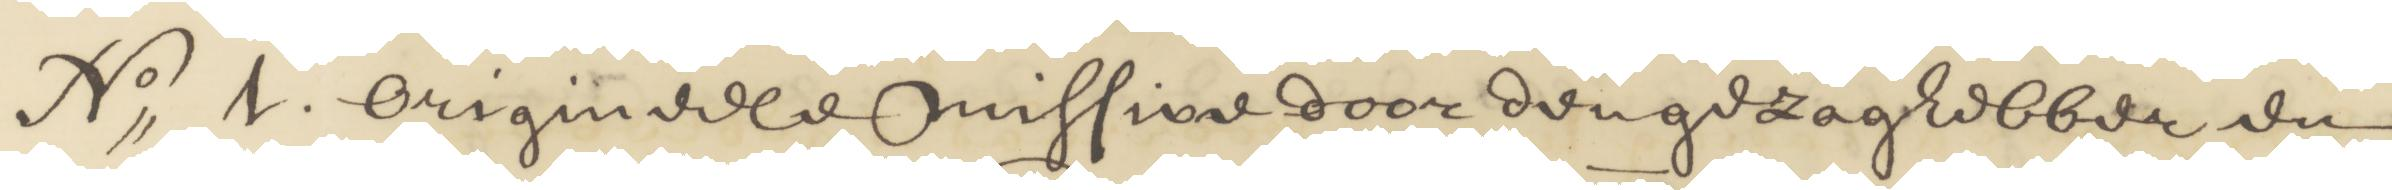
N„o 1. Origineele missive door den gezaghebber en
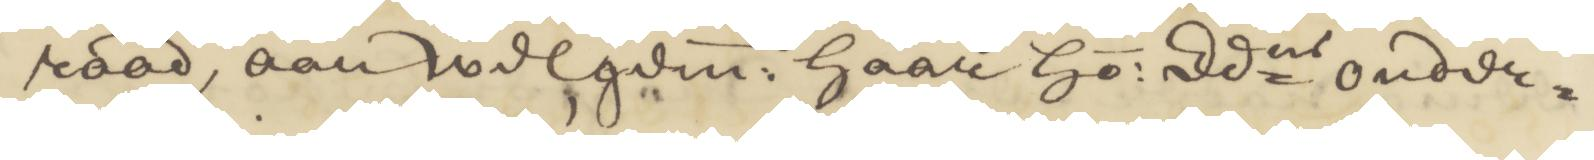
raad, aan welgem: haar ho: Ed=ns onder=
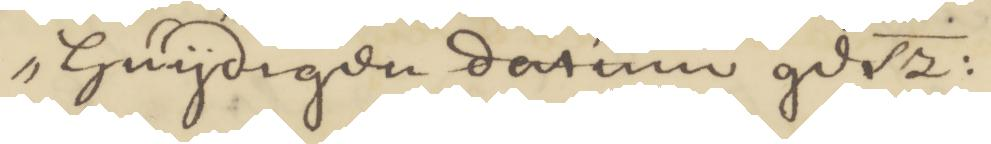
„huijdigen datum gesz:
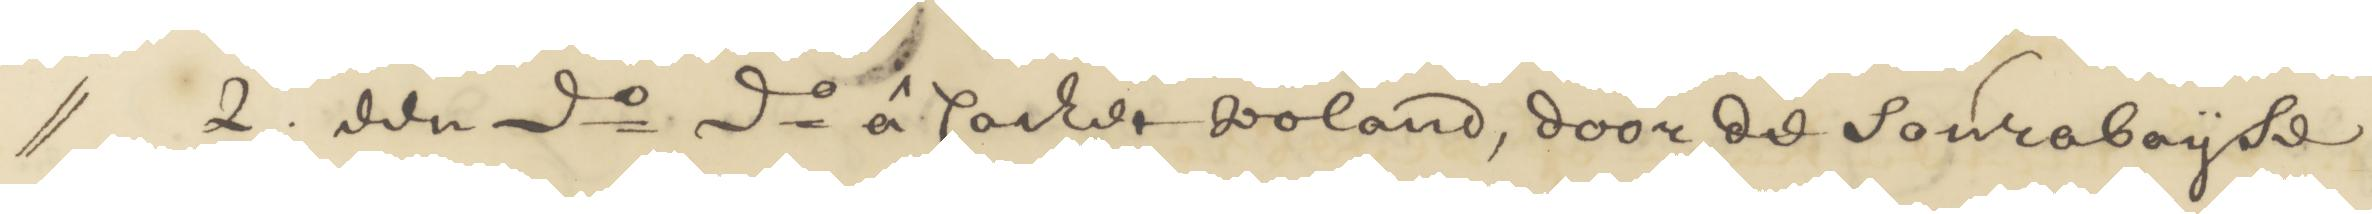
„ 2. een _=o _=o â Cochet voland, door de sourabaijse
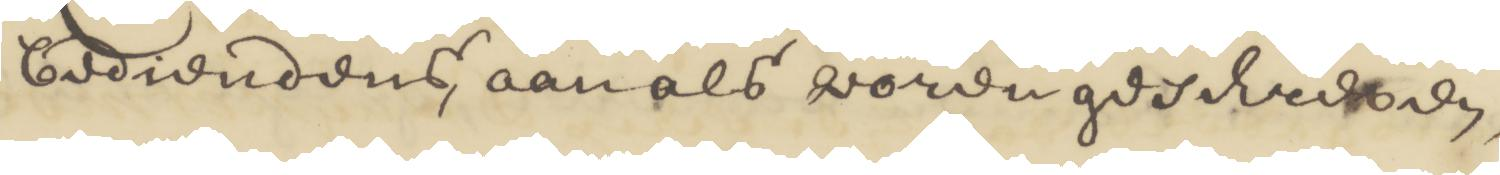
bediendens, aan als voren geschreven
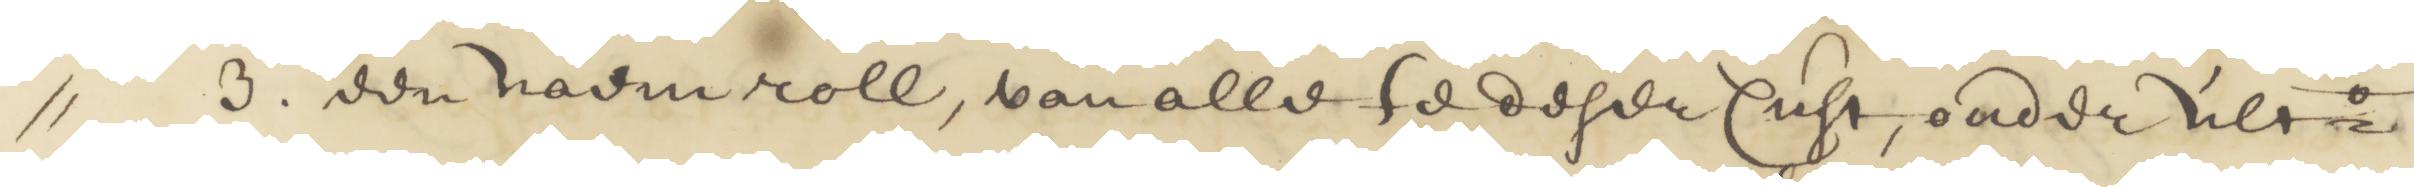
„ 3. een naem roll, van alle te deser Cust, onder ult=o
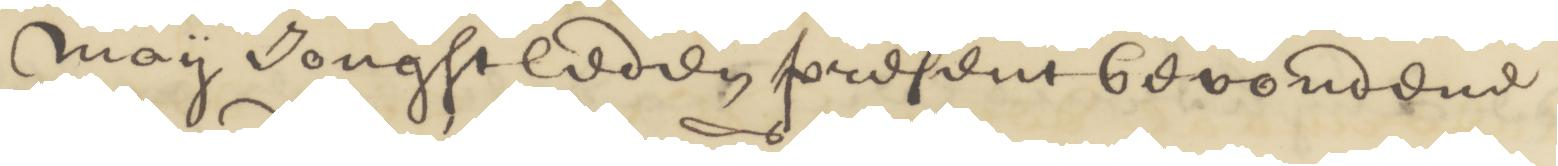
maij Jongstleden present bevondene
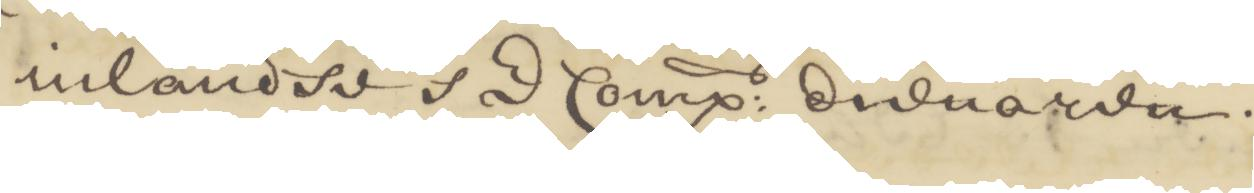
inlandse ’s E Comp:s dienaren.
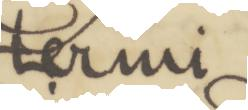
termi
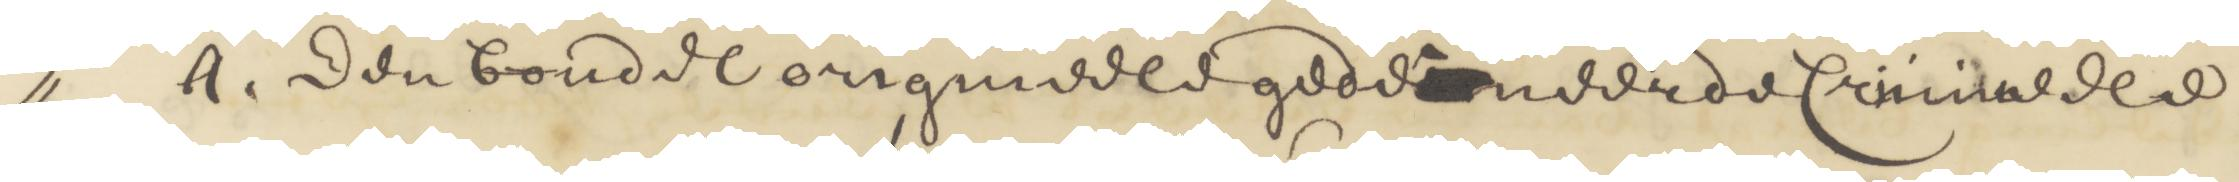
„ 4. Een bondel origineele gede^ neerde Crimineele
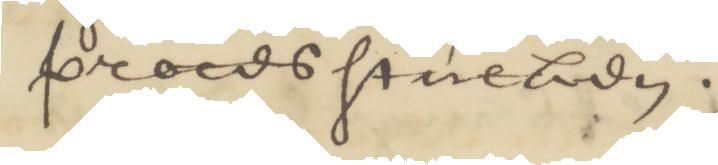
proces stucken.
